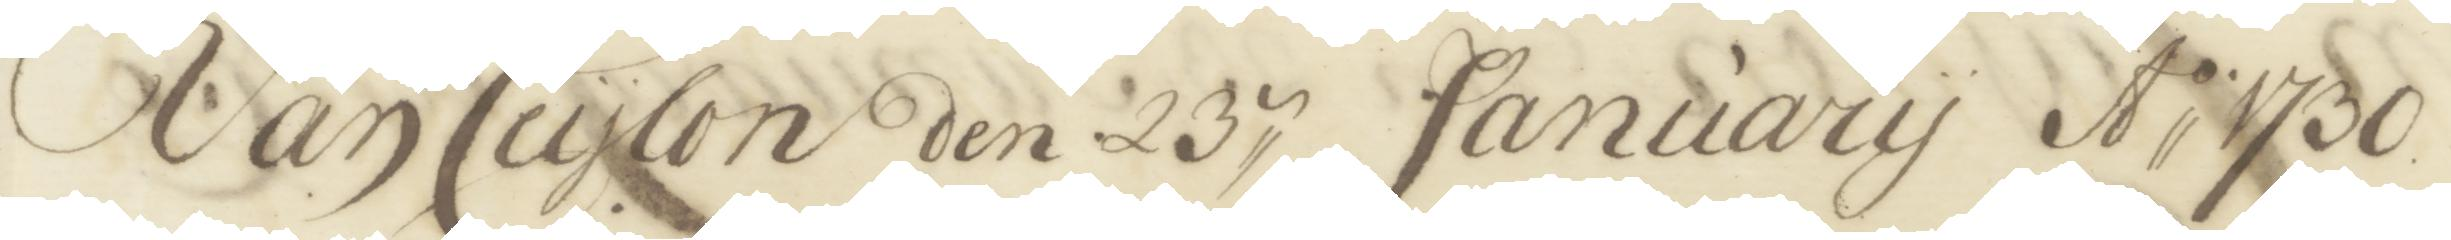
Van Ceijlon den 23„e Januarij A„o 1730.
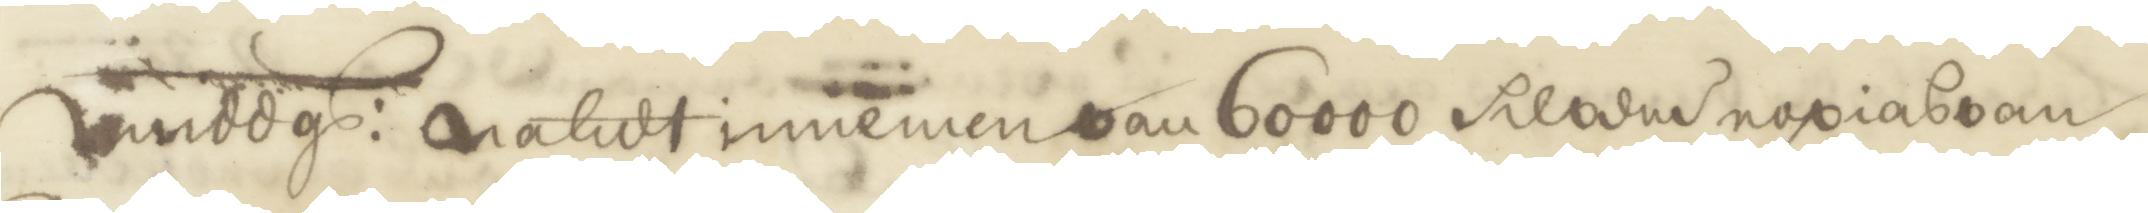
midddg:s na het innemen van 60000 Silvere ropias van
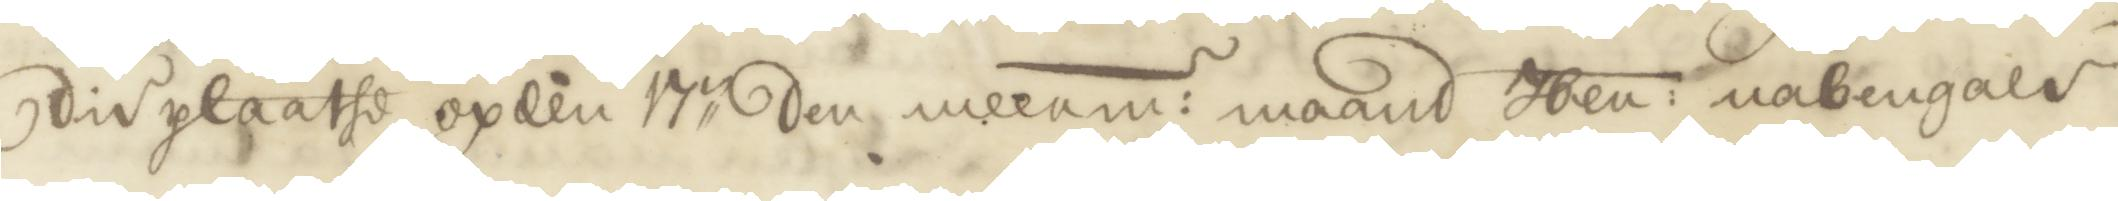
die plaatse op den 17„e der meerm:s maand 7ber: na bengale
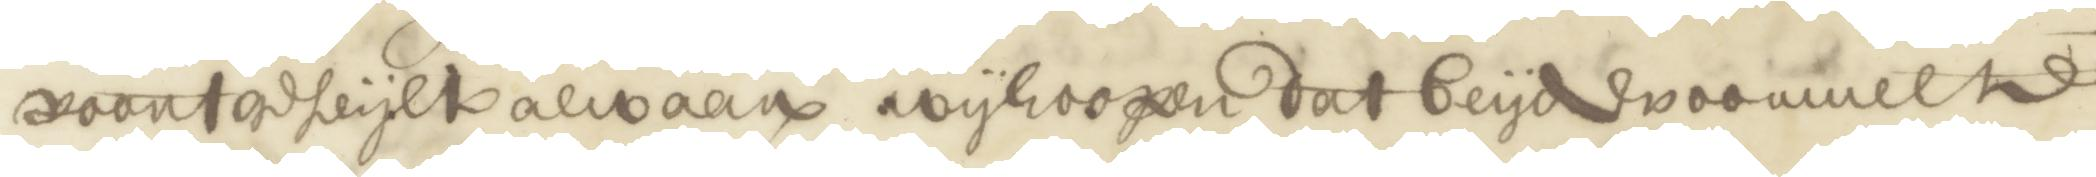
voortgeseijlt alwaar wij hoopen dat beijde voormelte
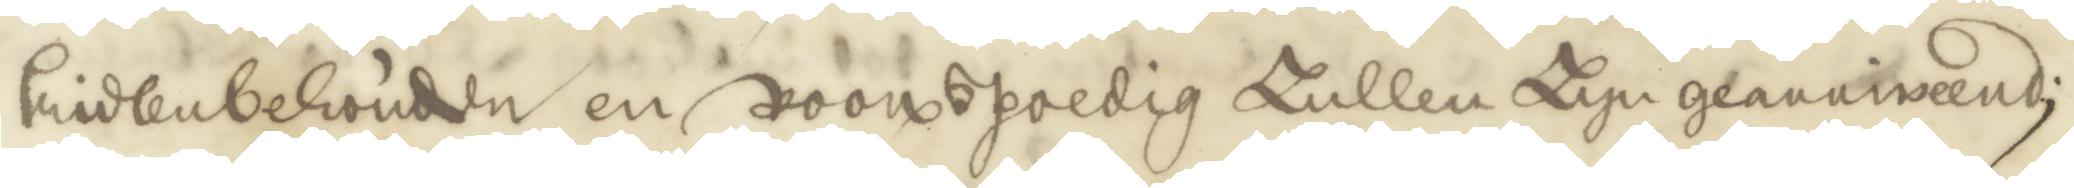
kielen behouden en voorspoedig Zullen Zyn gearriveerd;
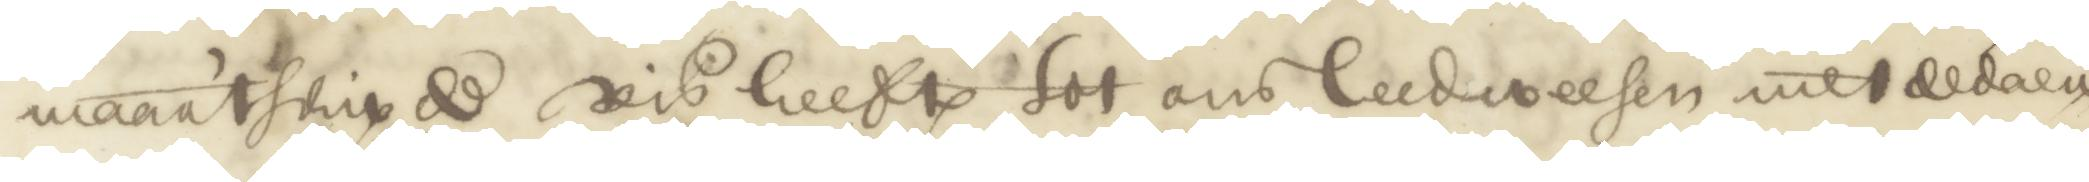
maar 't schip de vis heeft tot ons leedweesen met de daer
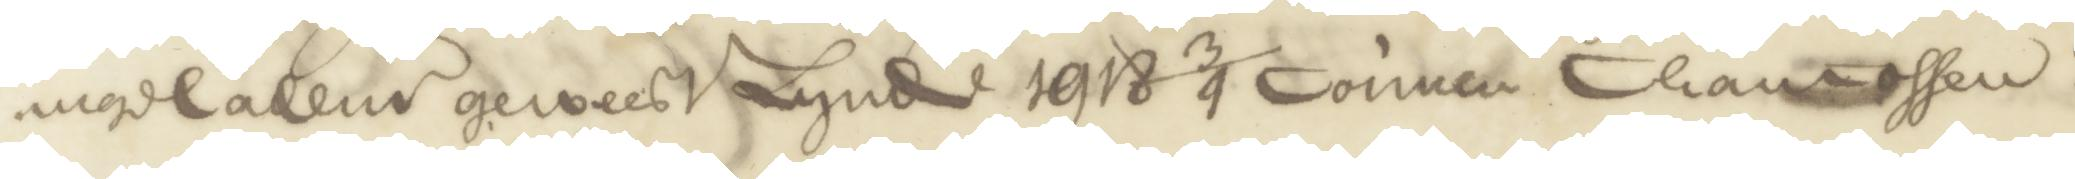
ingeladene geweest Zynde 1918 ¾ couren Chancossen
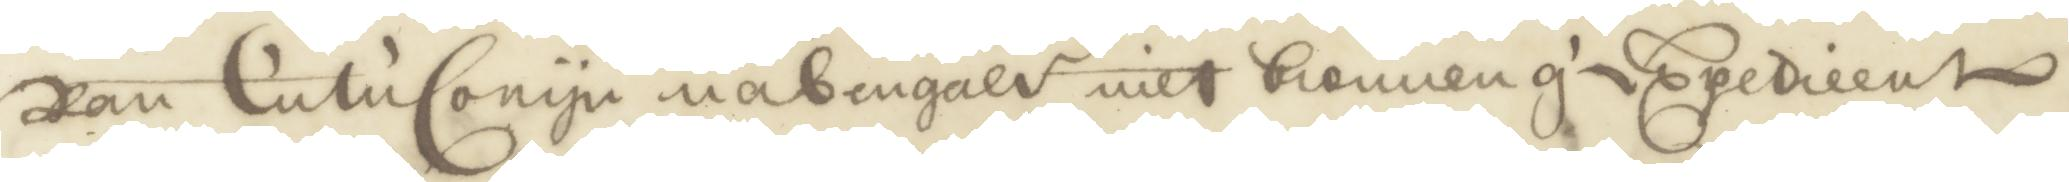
van Cutucorijn nabengale niet konnen g’Expedieert
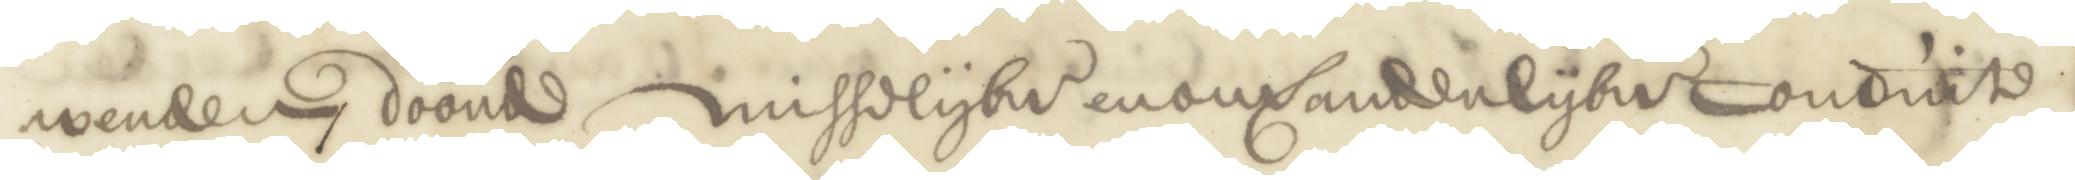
werden, doorde misselijke en onveranderlijke conduite
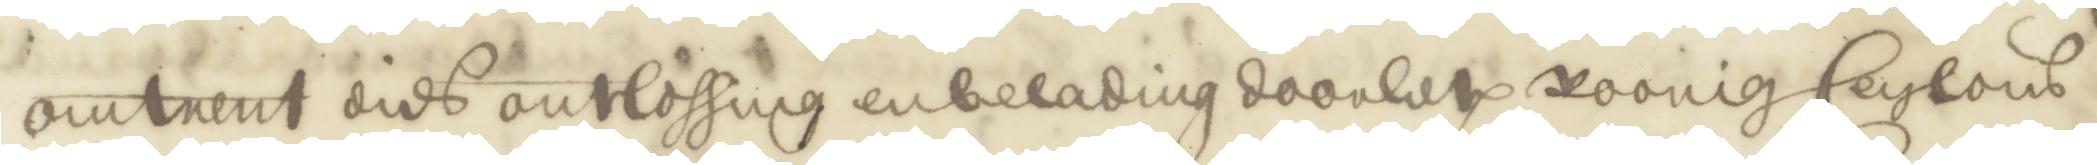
omtrent dies ontlossing en belading door het voorig Ceylons
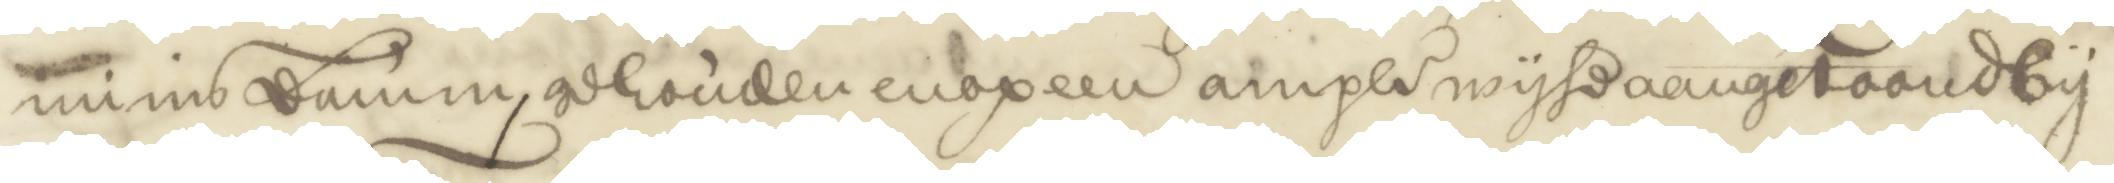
ministerium, gehouden en op een ample wijse aangetoond bij
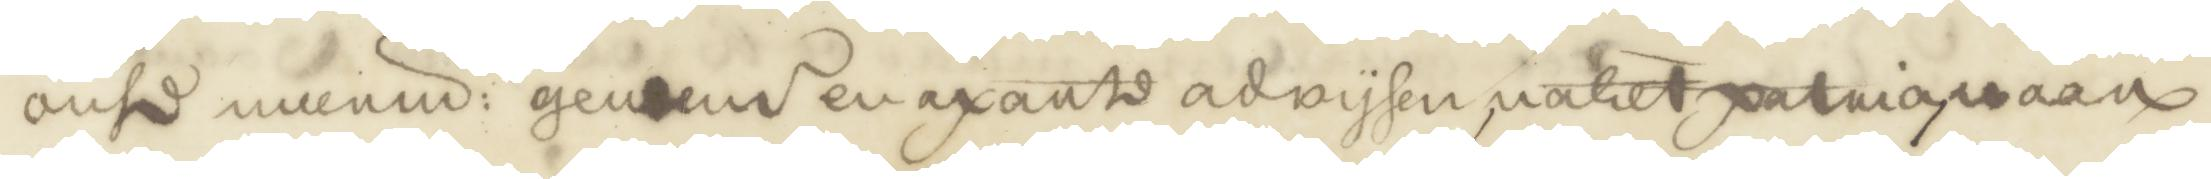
onse meerm: gemene en aparte advijsen na het patria waar
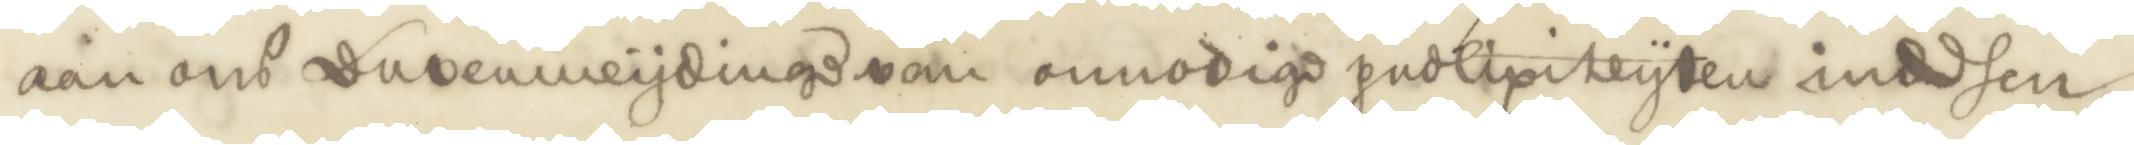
aan ons ter vermeijdinge van onnodige prelixiteijten in desen
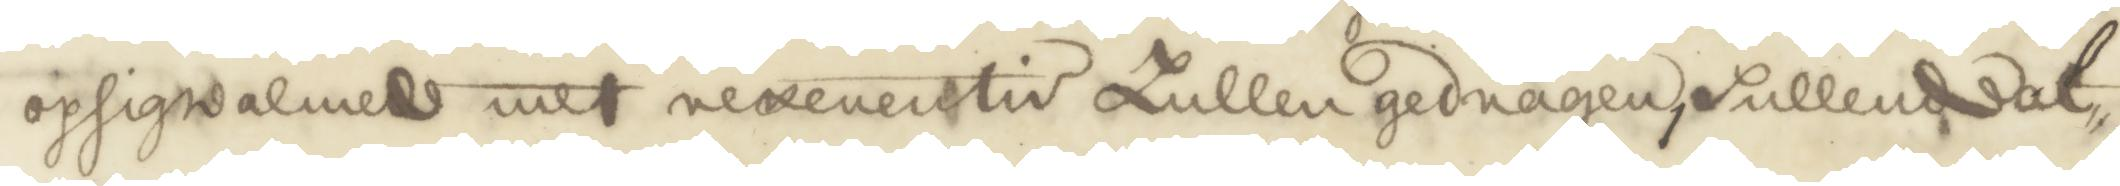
opsigte almede met reverentie Zullen gedragen, Sullende al„
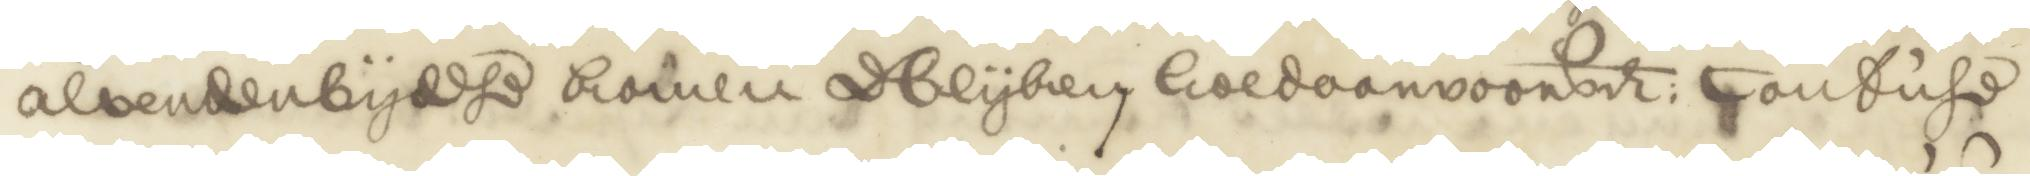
alverder bij dese komen te blijken hoe door voorsch: confuse
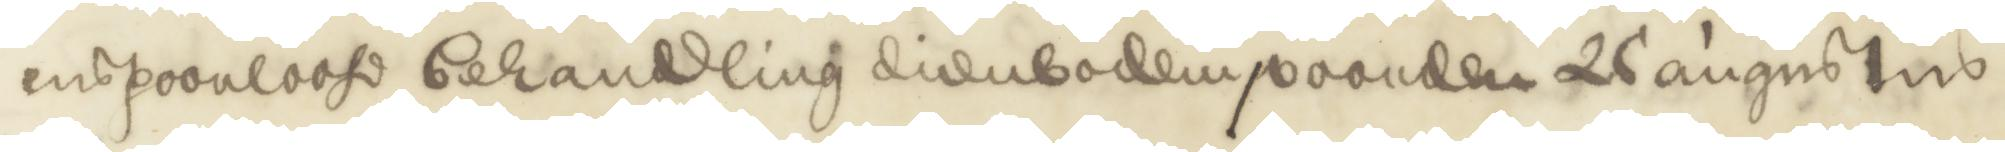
enspoorloose behandeling dien bodem /, voor den 25 augustus
